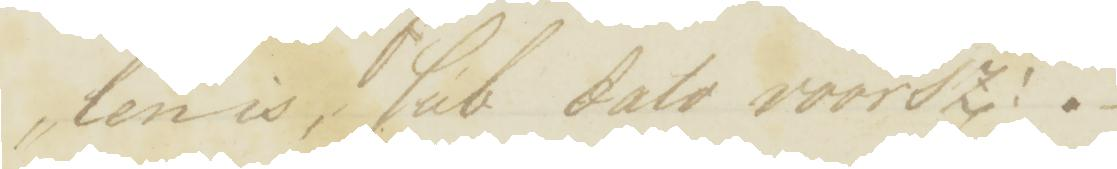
„len is, sub dato voorsz:.
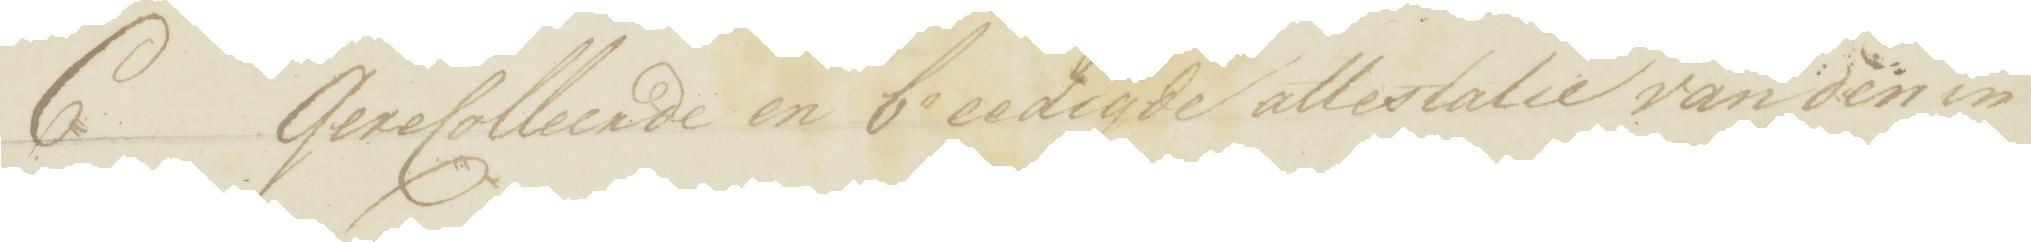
C Gerecolleerde en b"eedigde attestatie van den in
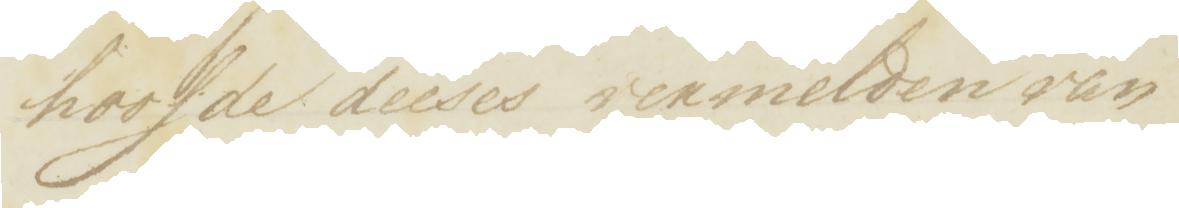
hoofde deeses vermelden van
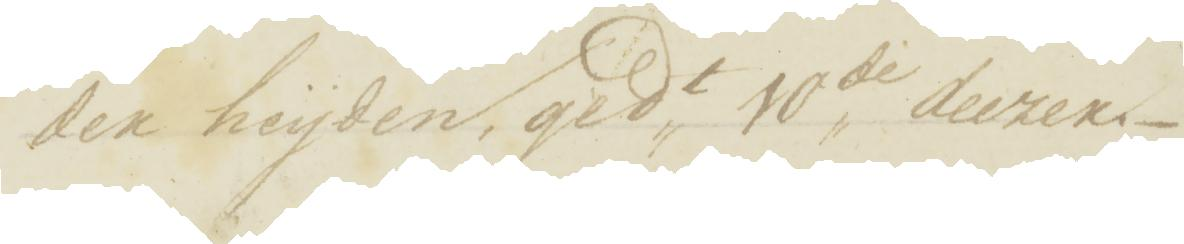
der heijden, ged„t 10„de deezer.
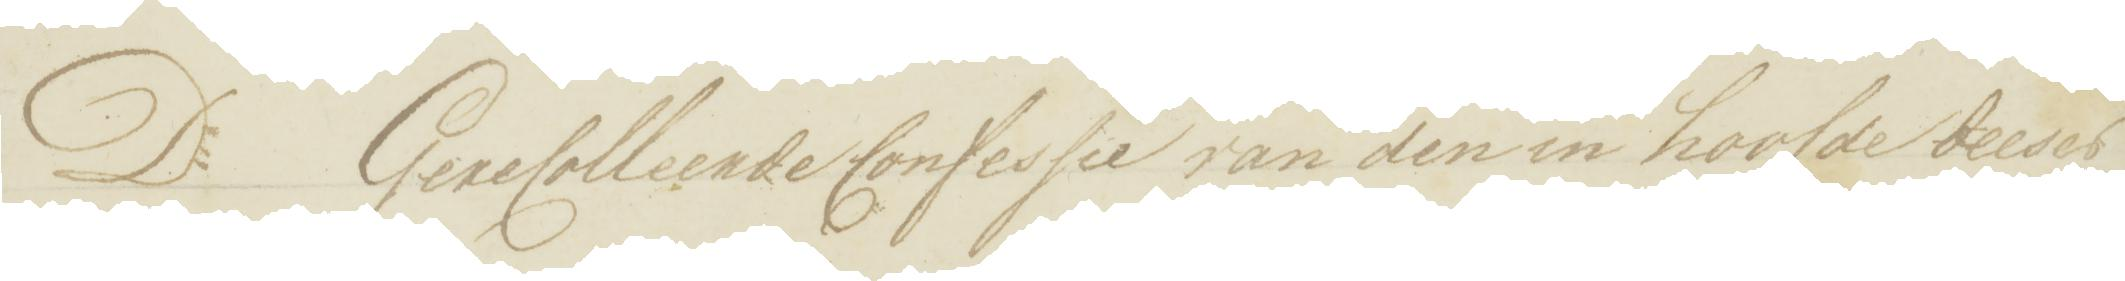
D Gerecolleerde Confessie van den in hoofde deeses
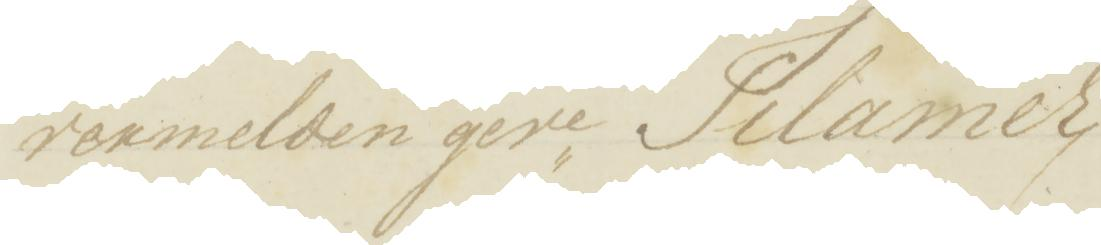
vermelden gev„e Silameh
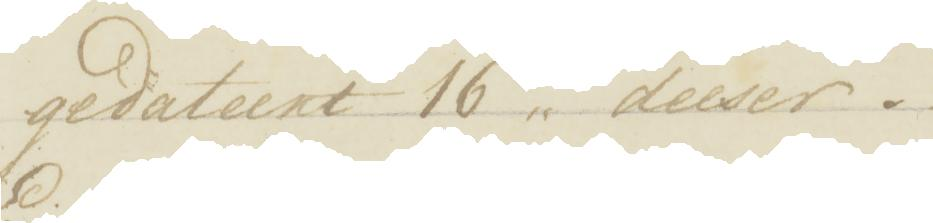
gedateert 16„de deeser.
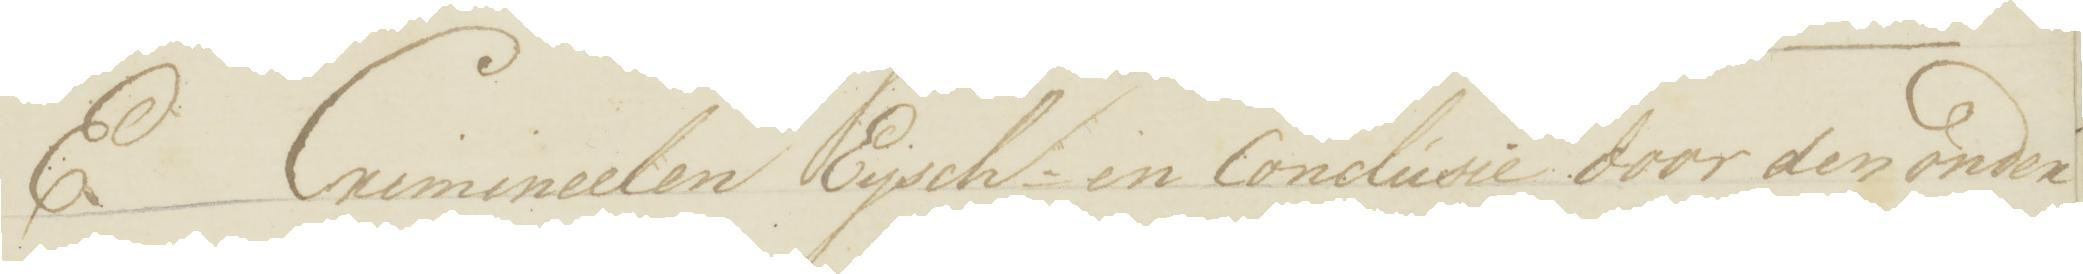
E. Crimineelen Eijsch in conclusie door den onder
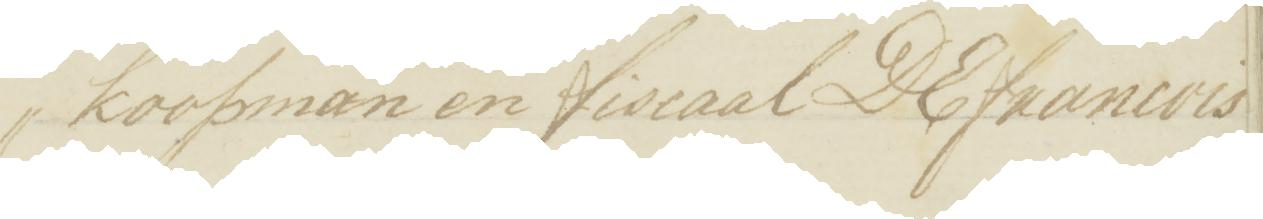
„koopman en fiscaal DE francois
